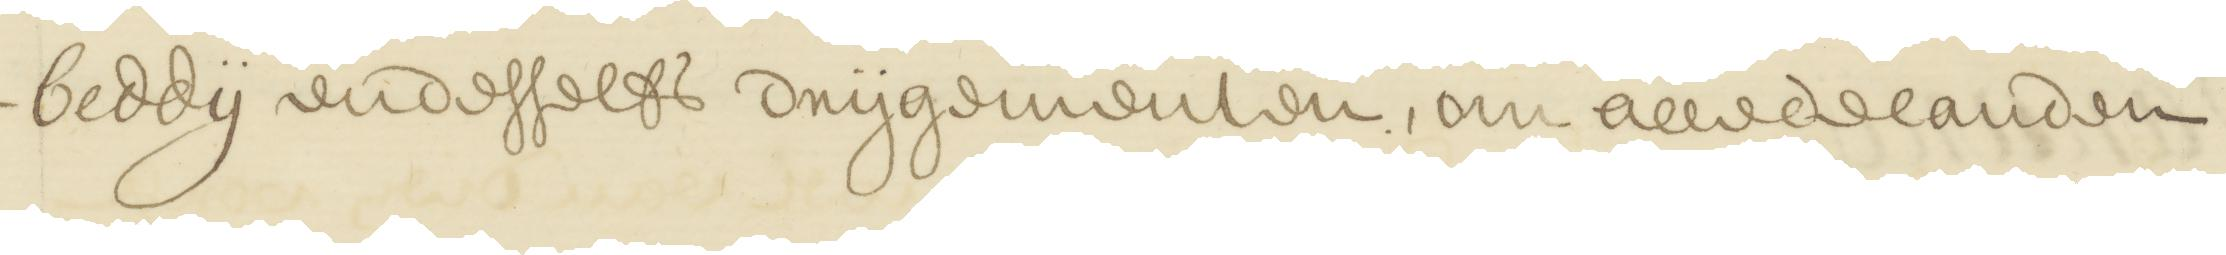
beddij en desselfs drijgementen, om alle de landen
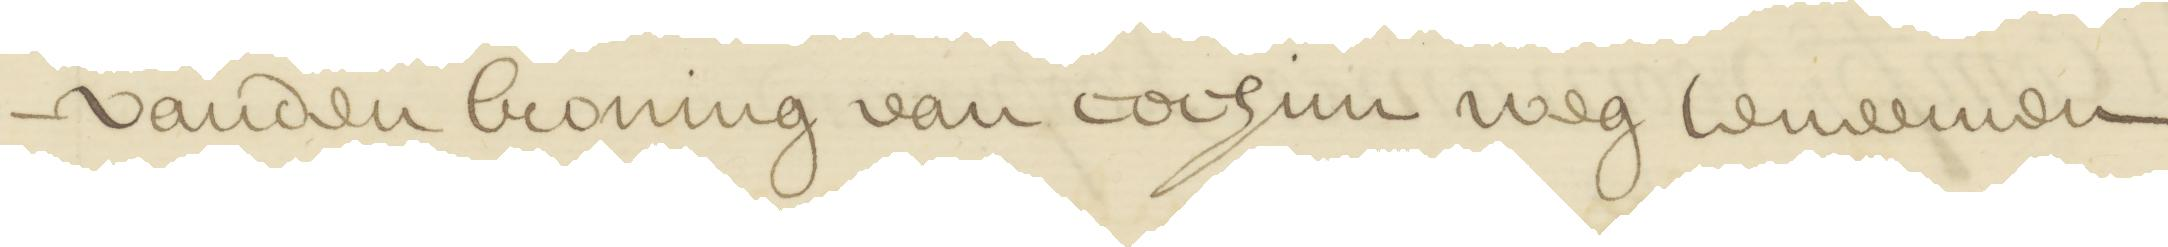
van den koning van cochim weg teneemen
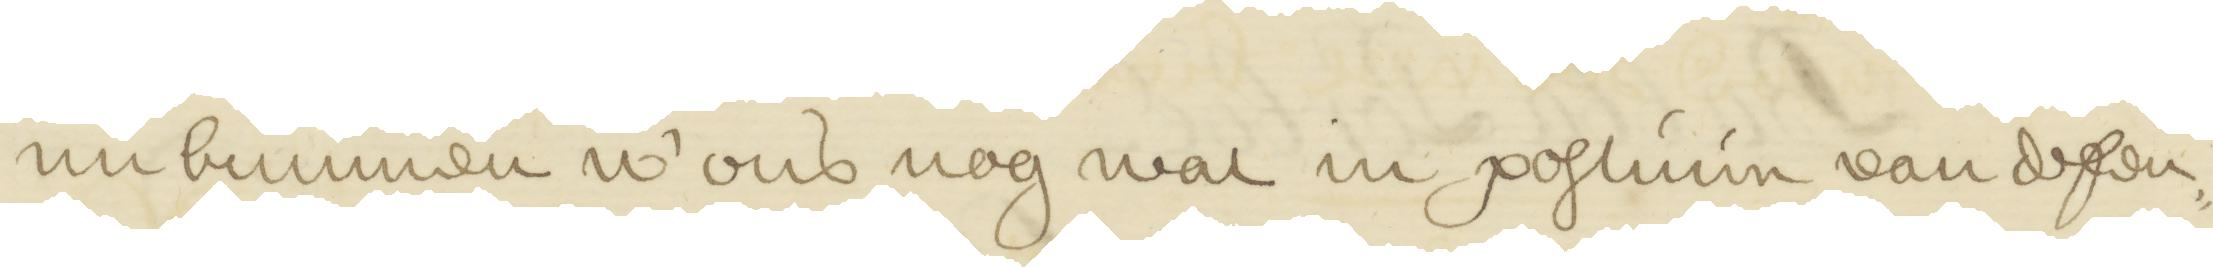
nu kunnen w' ons nog wat in postuur van desen„
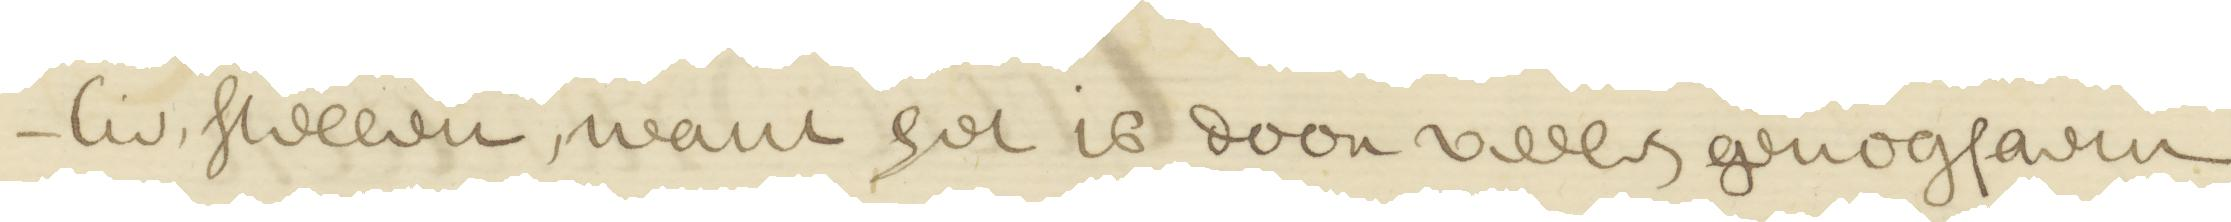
tie, stellen, want het is door veelen genogsaem
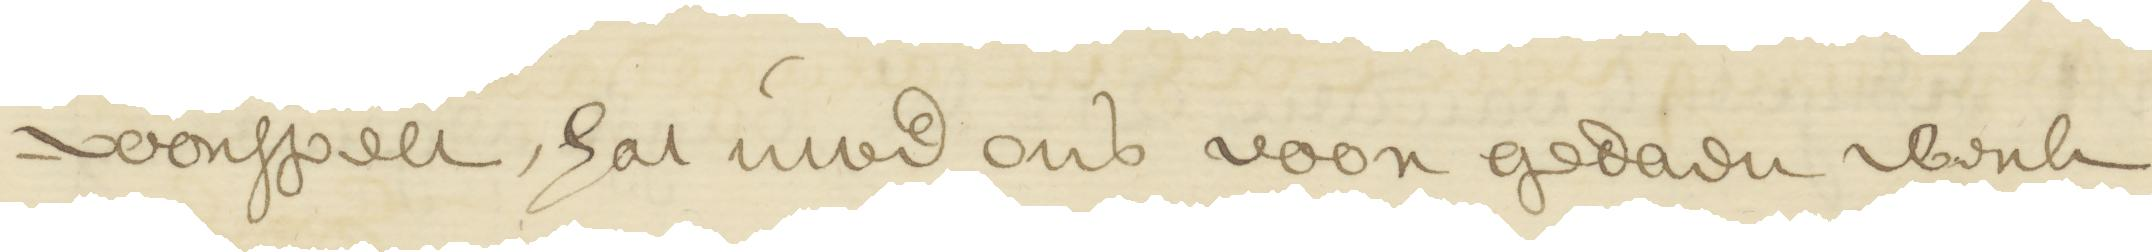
voorspelt, hat uwE ons voor gedaen werk
